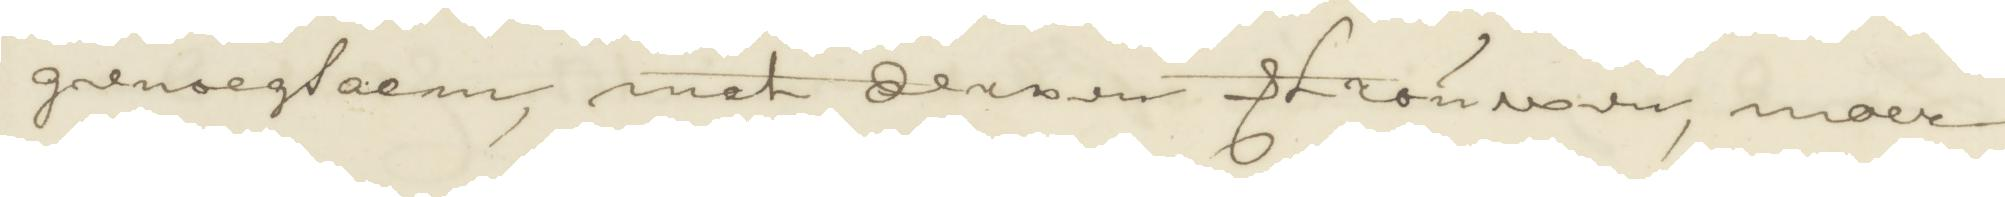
genoegsaem, niet derven vertrouwen, maer
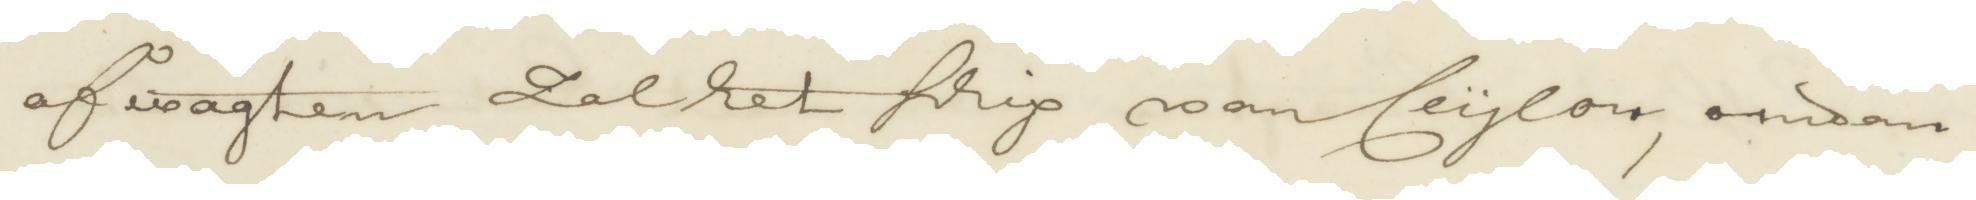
afwagten zal het schip van Ceijlon, om dan
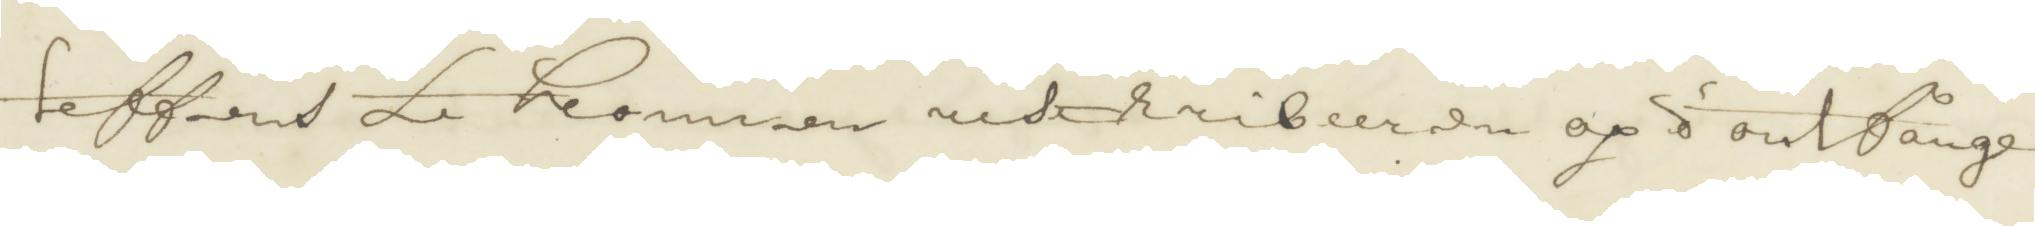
teffens te konnen reschribeeren op d' ontfange
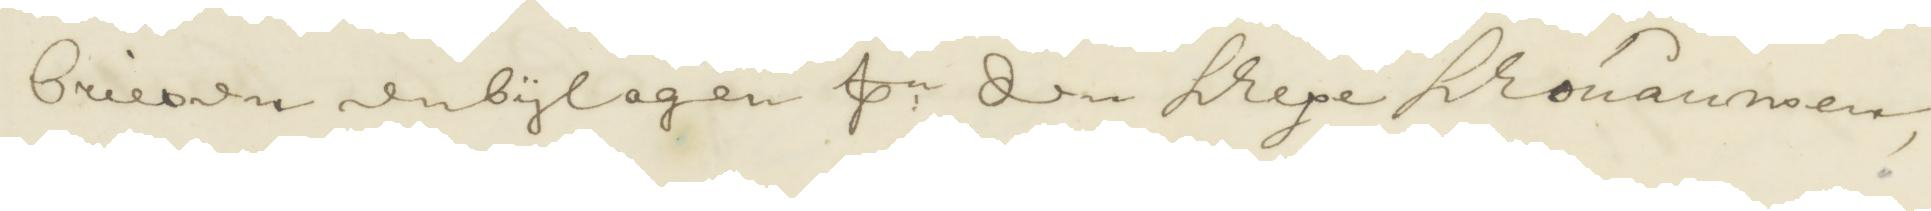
brieven en bijlagen p:r den schepe schonauwen,
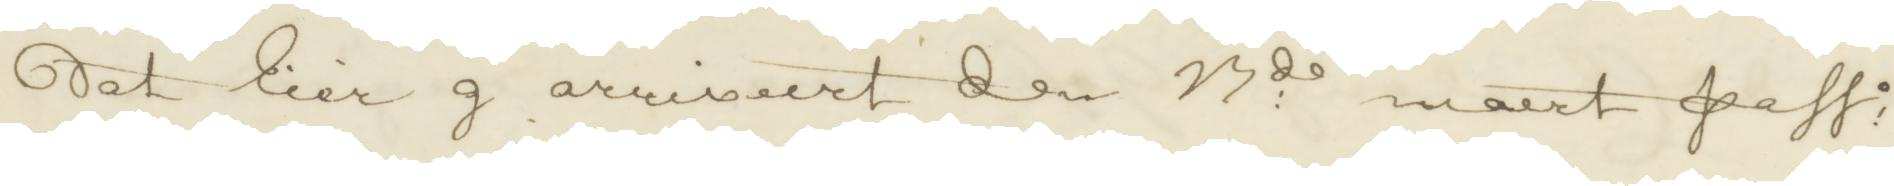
dat hier g’arriveert den 17:de maert pass:o
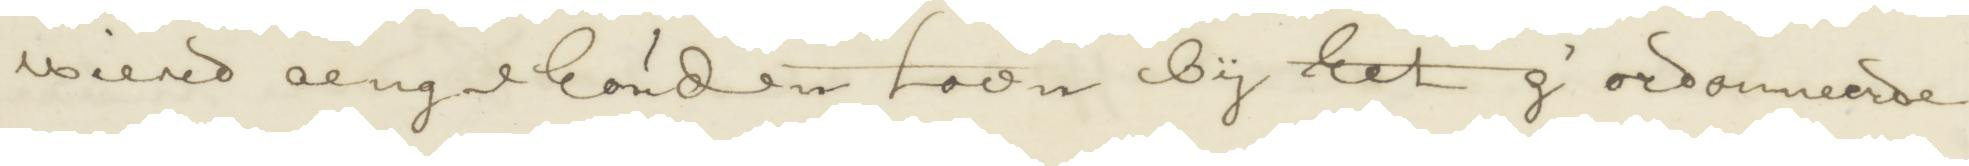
wierd aengehouden, toen bij het g’ordonneerde
